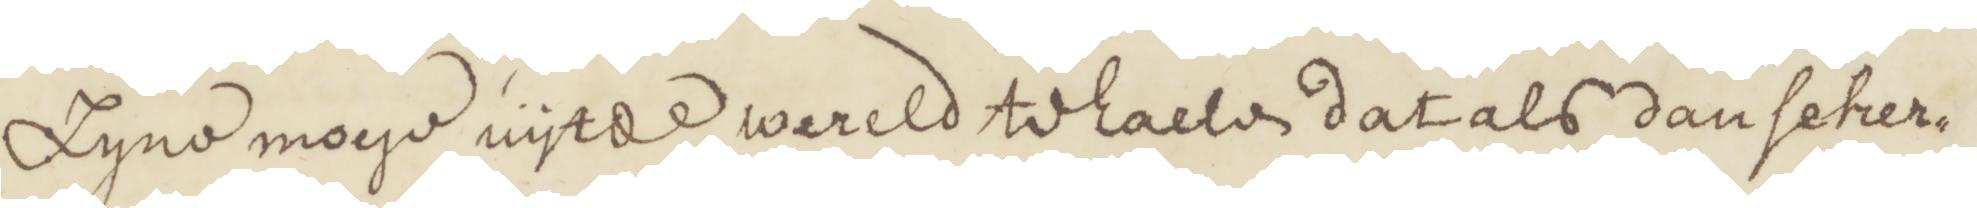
zyne moeje uijt de wereld te haelen dat als dan seker„
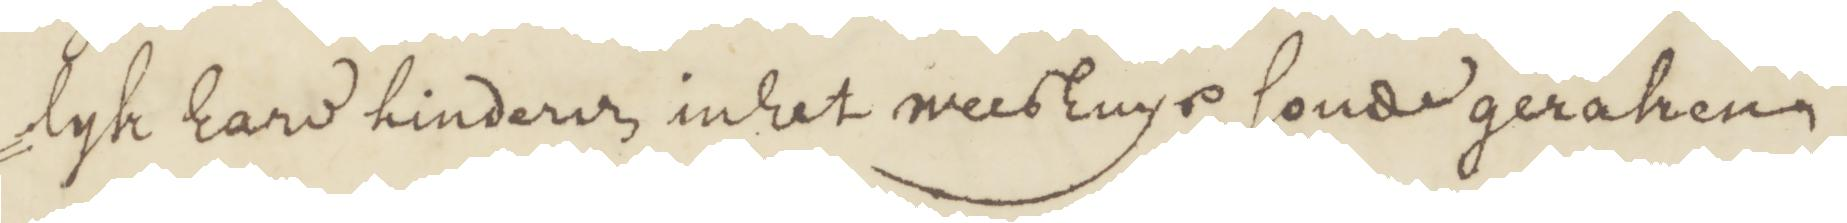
=lyk hare kinderen in het weeshuys soude geraken
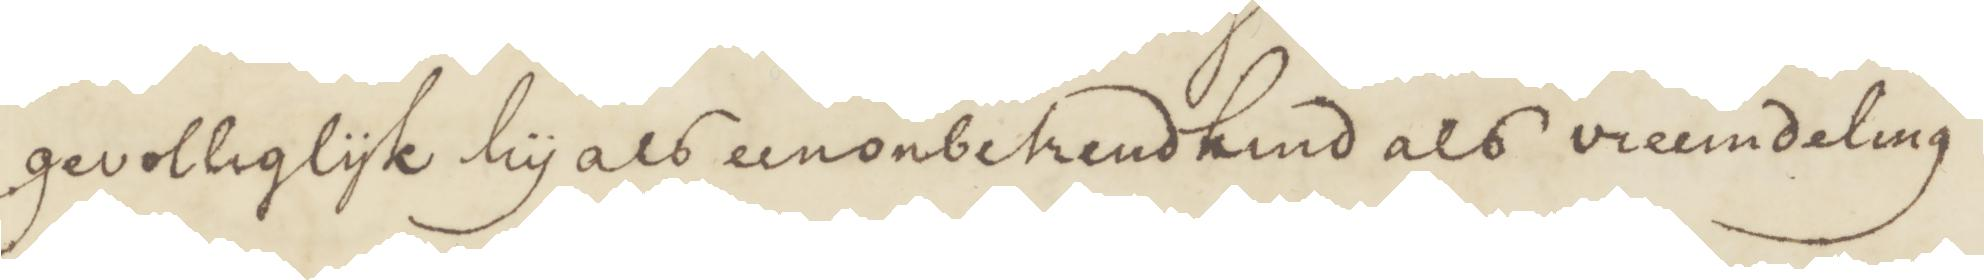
gevolliglijk hij als een onbekend kind als vreemdeling
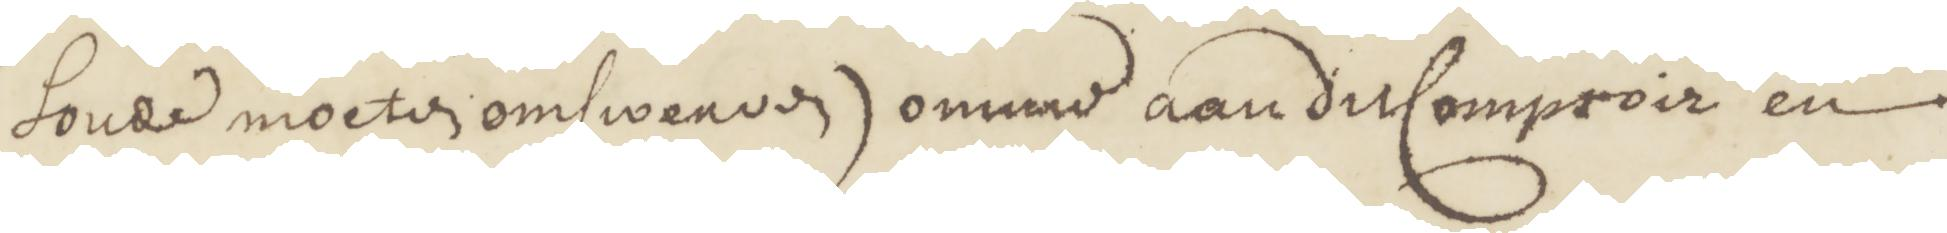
soude moeten omswerven) omme aan dit Comptoir en
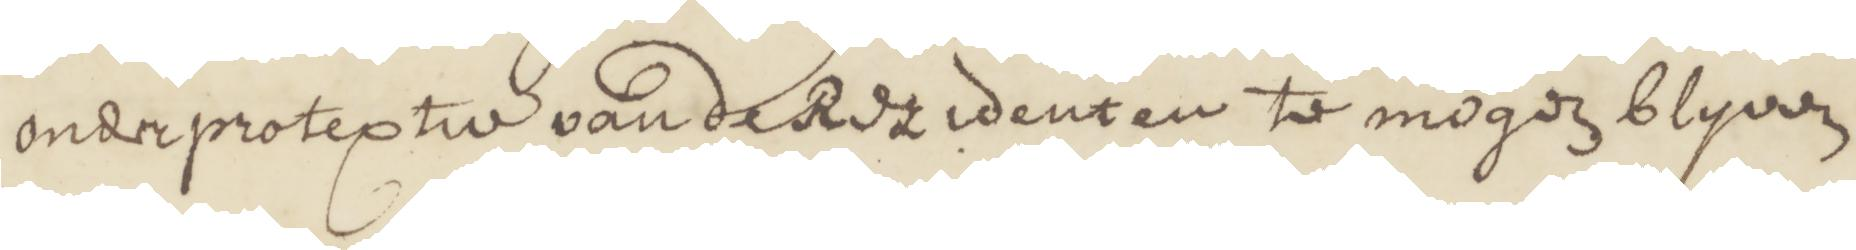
onder protextie van de Rezidenten te mogen blyven
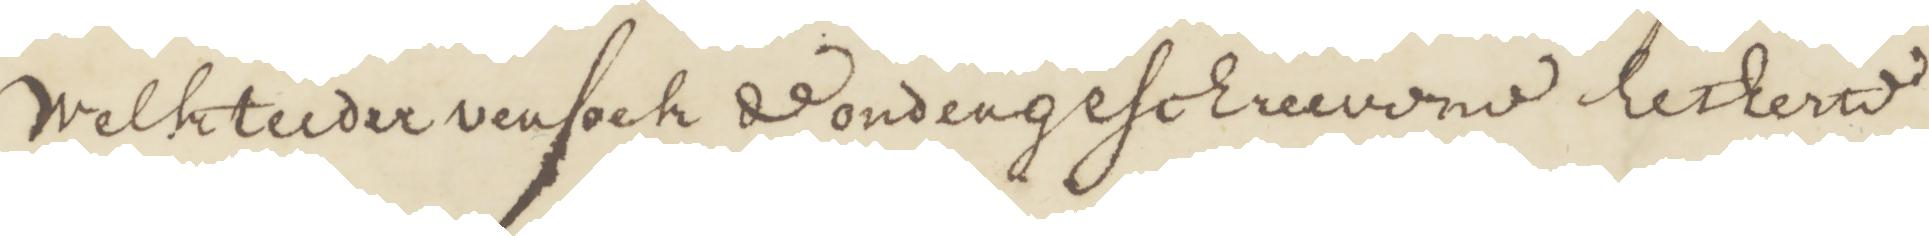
welk teeder versoek de ondergeschreevene het herte
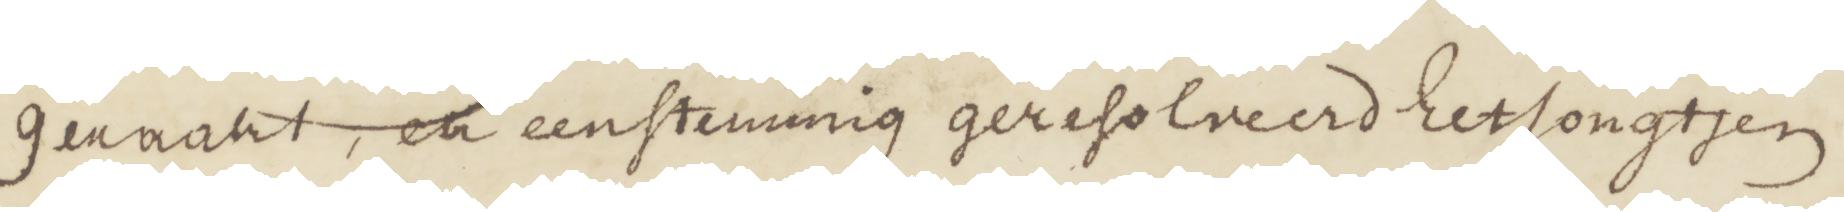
geraakt, en eenstemmig geresolveerd het jongtjen
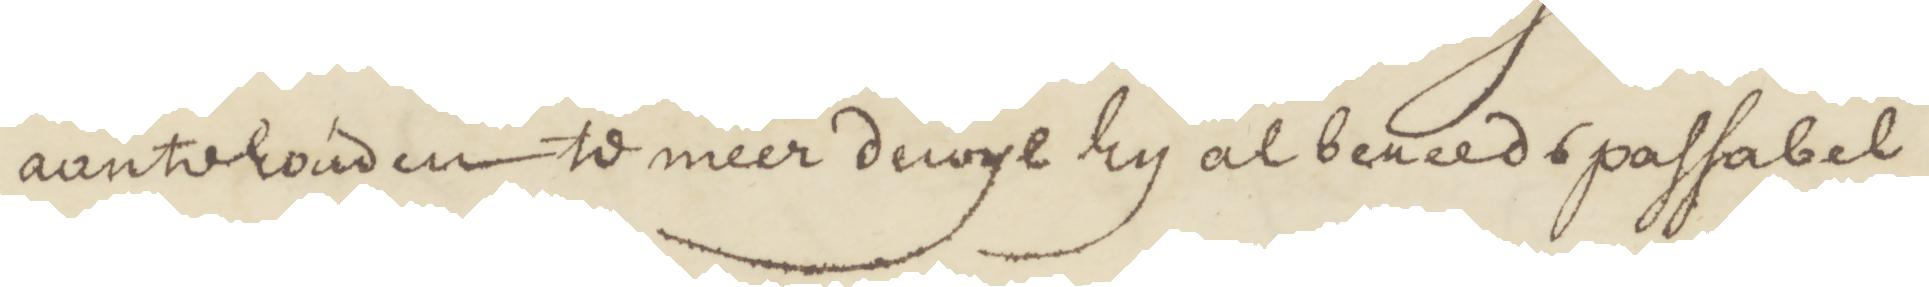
aantehouden te meer dewyl hy al bereeds passabel
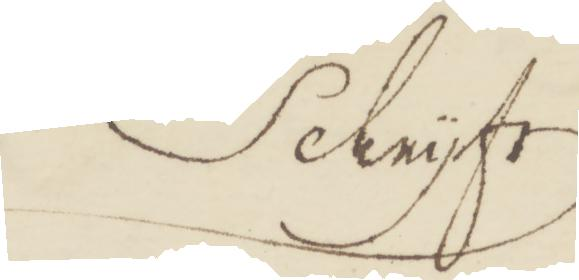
Schijft
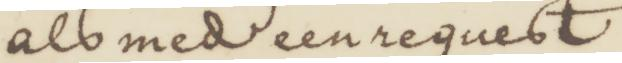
als mede een request
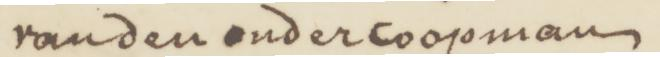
van den ondercoopman
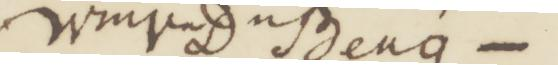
Wm Vn Dn Berg –
